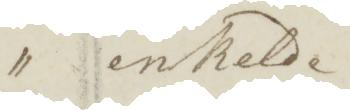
„ enkelde
